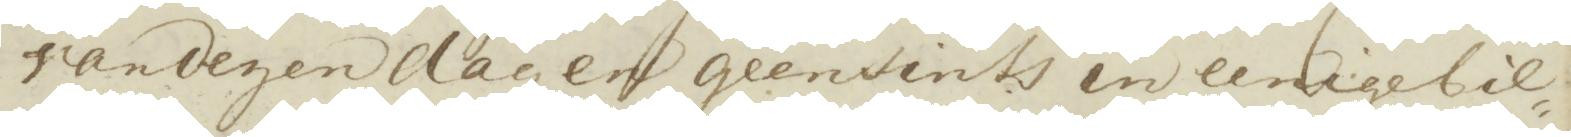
van dezen dag en geensints in eenige bil„
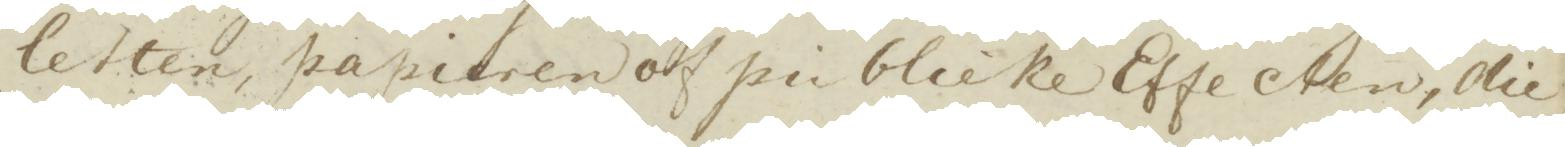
letten, papieren of publieke Effecten, die
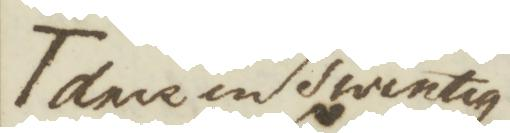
¶ drie en Twintig
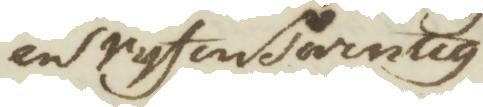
en vyf en Twintig
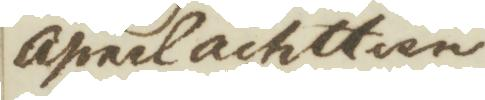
April achttien
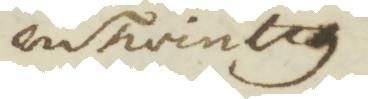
en Twintig
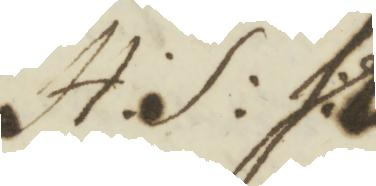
H: S: J.r
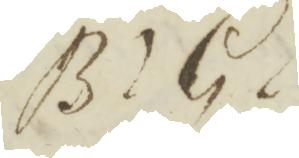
B:G:
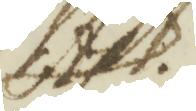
W.A.H.
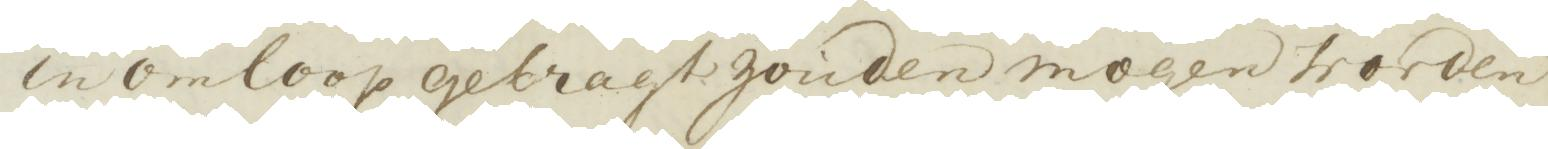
in omloop gebragt zouden mogen worden
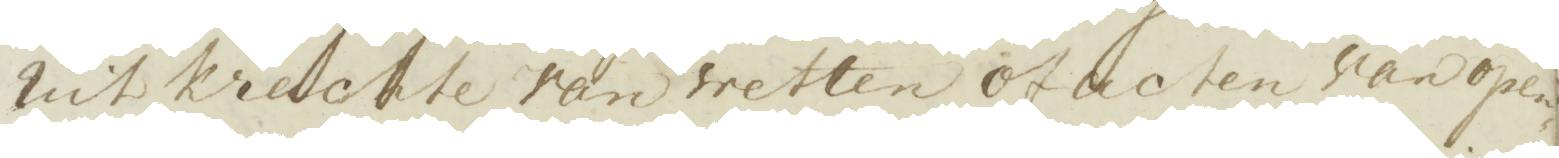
uit krachte van wetten of acten van open„
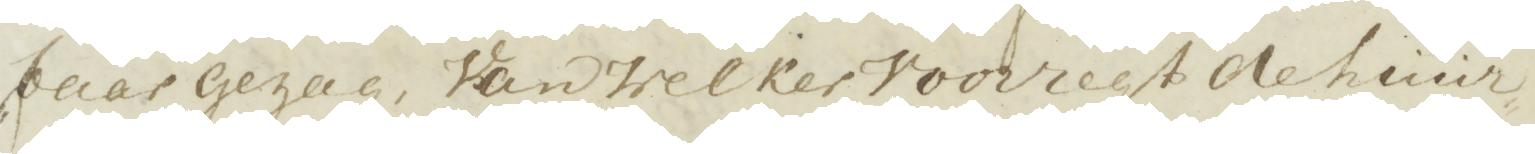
baar gezag, van welker voorregt de huur„
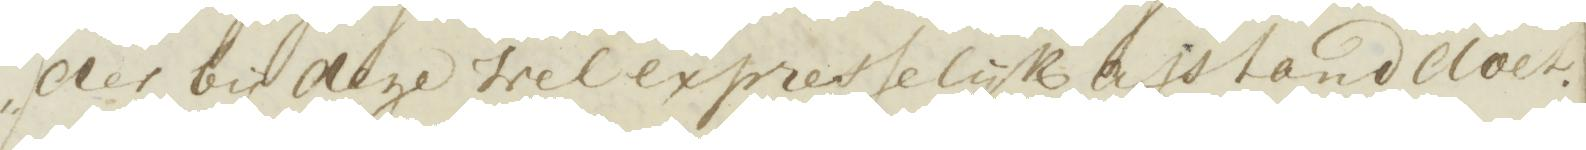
„der bij deze wel expresselijk afstand doet.
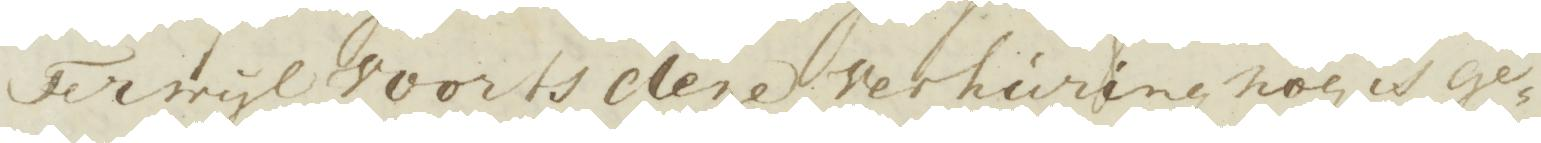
Terwijl voorts deze verhuring nog is ge„
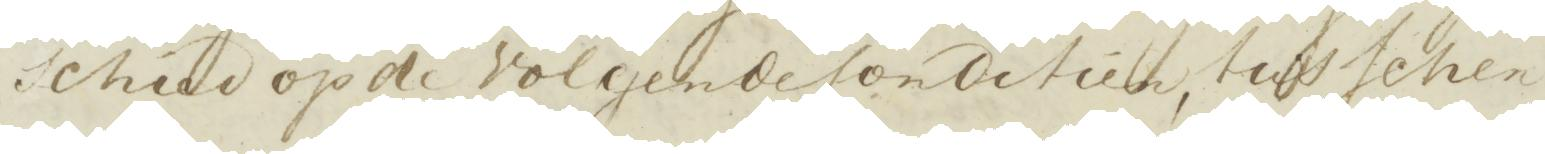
schied op de volgende Conditien, tusschen
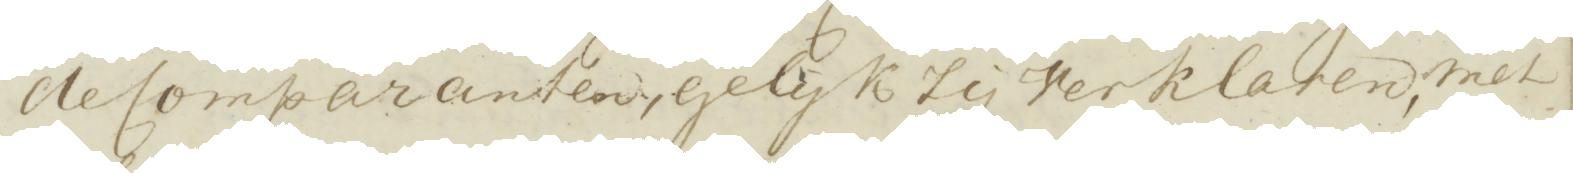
de Comparanten, gelijk zij verklaren, met
